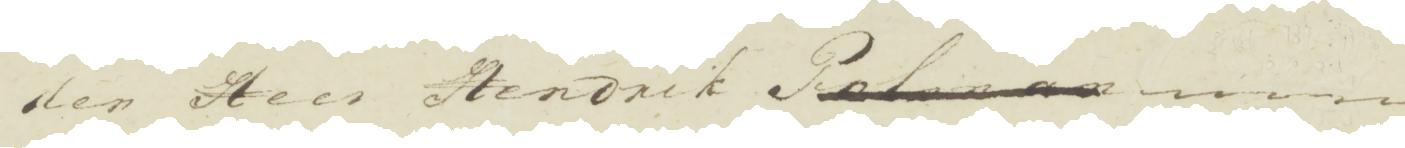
den Heer Hendrik Polman
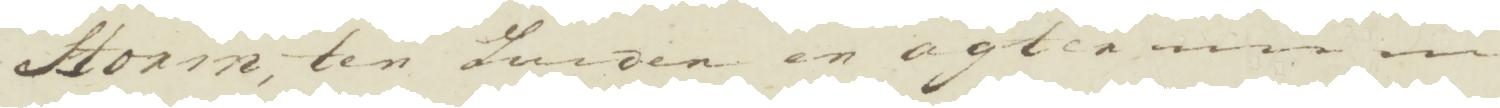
Storm, ten Zuiden en agter
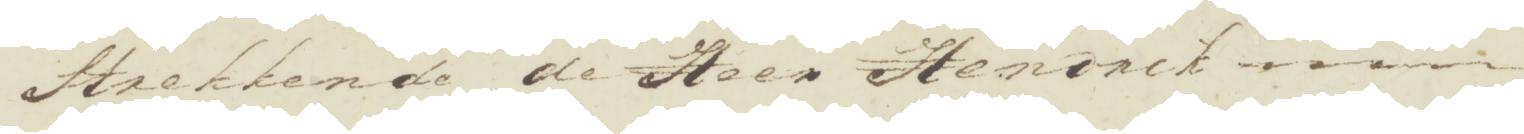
strekkende de Heer Hendrik
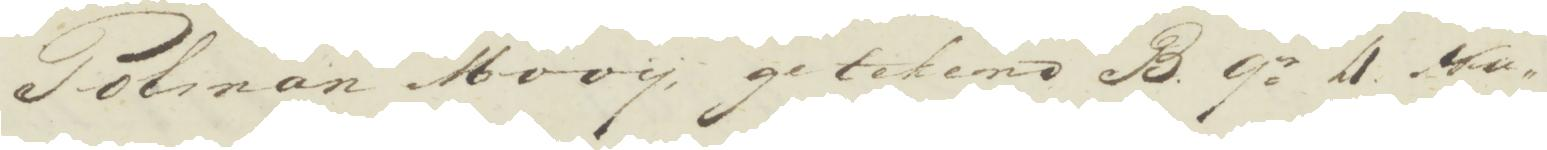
Polman Mooij, getekend B. g„s 4. nu„
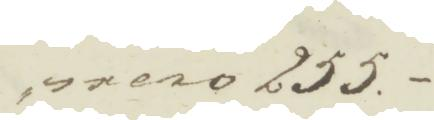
„mero 255. -
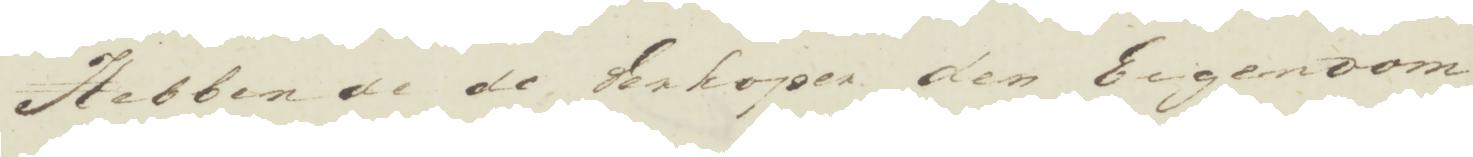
Hebbende de verkoper den Eigendom
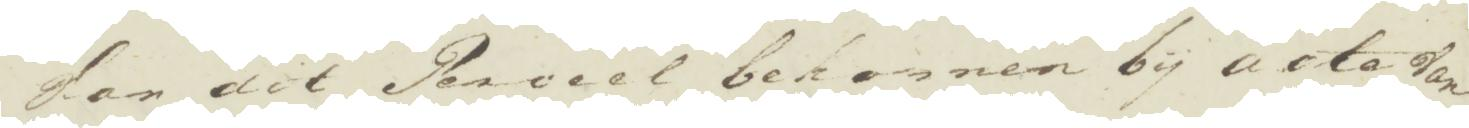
van dit Perceel bekomen bij acte van
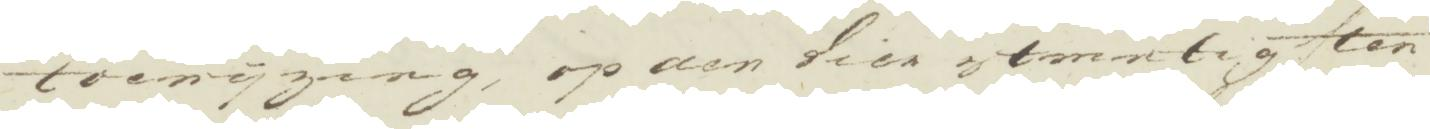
toewijzing, op den vier entwintigsten
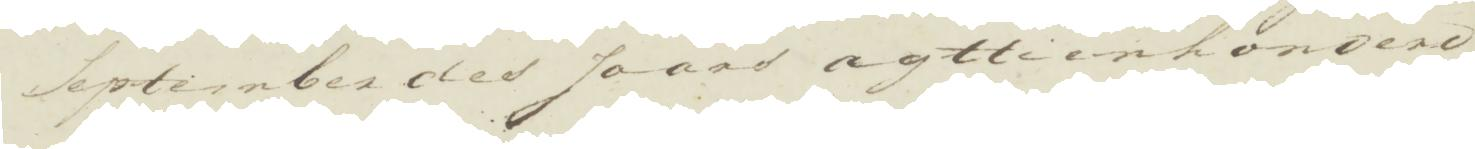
September des Jaars agttienhonderd
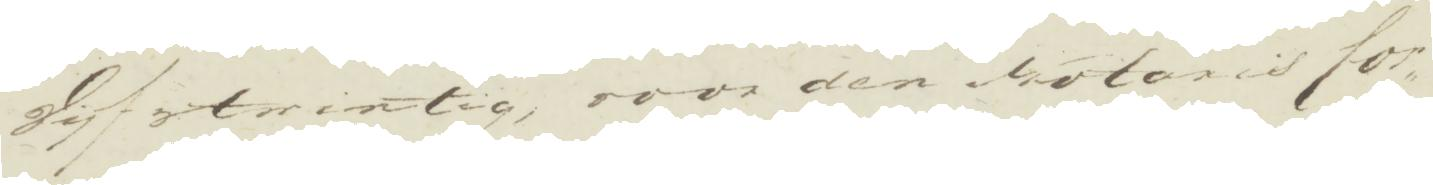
Vijf entwintig, voor den Notaris Cor„
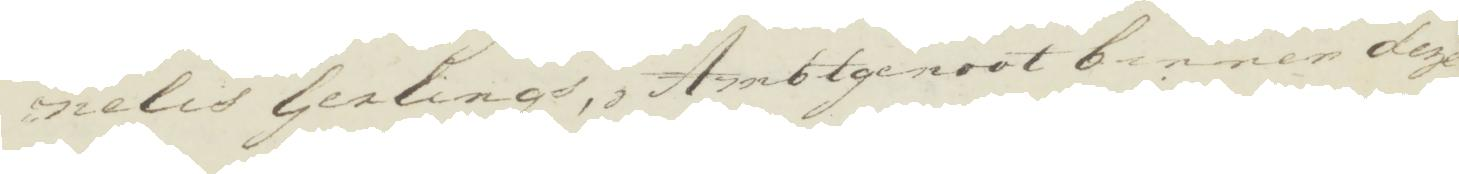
„nelis Gerlings, en Ambtgenoot binnen deze
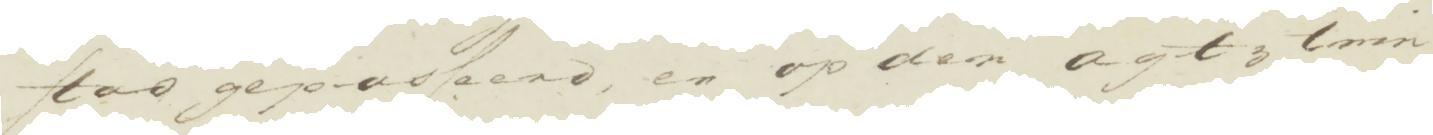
stad gepasseerd, en op den agt en twin
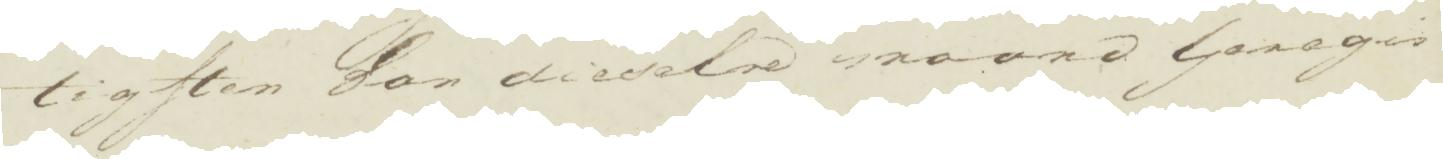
tigsten van dieselve maand Geregis
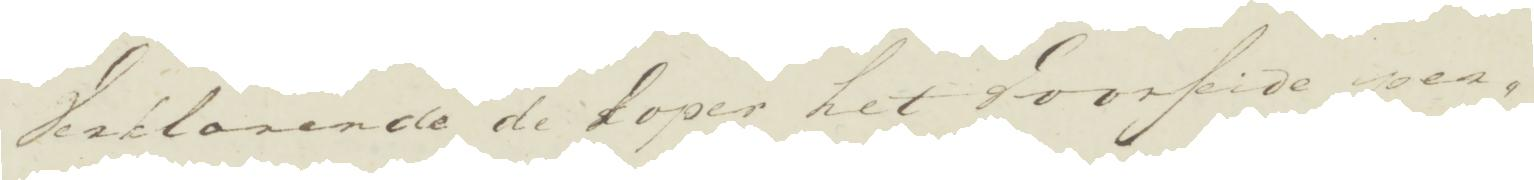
Verklarende de koper het voorseide per„
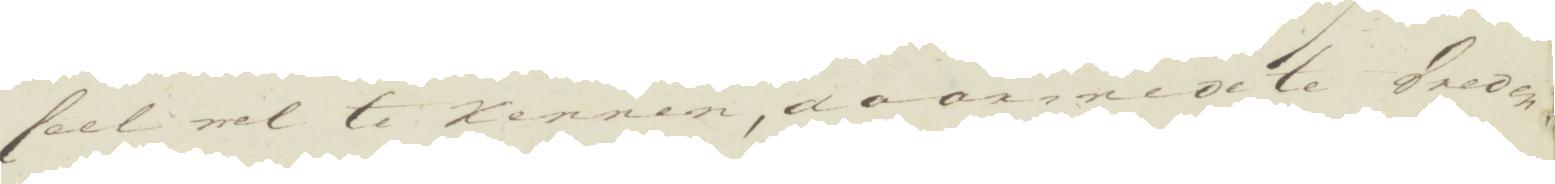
ceel wel te kennen, daarmede te vreden
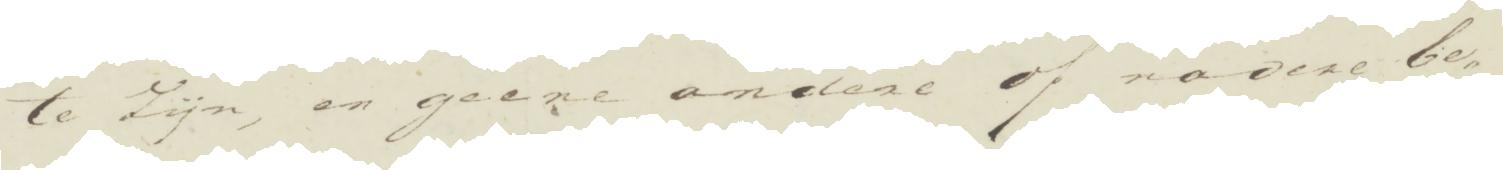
te zijn, en geene andere of nadere be
